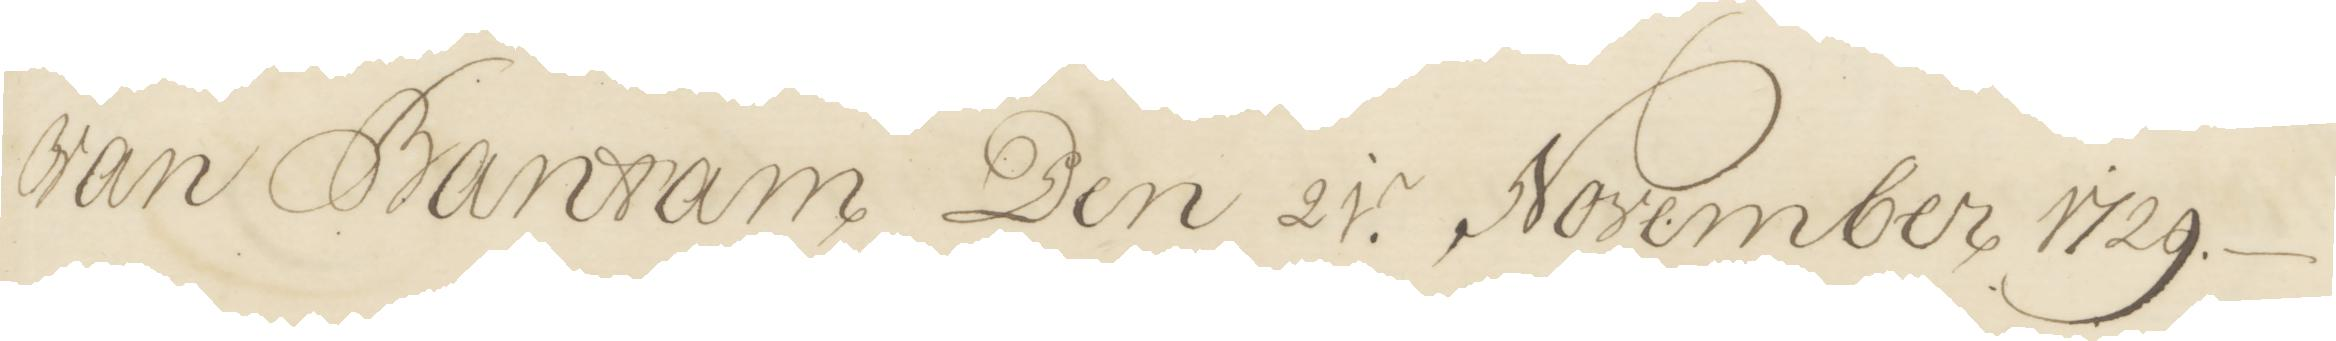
Van Bantam Den 21.e November 1729. —
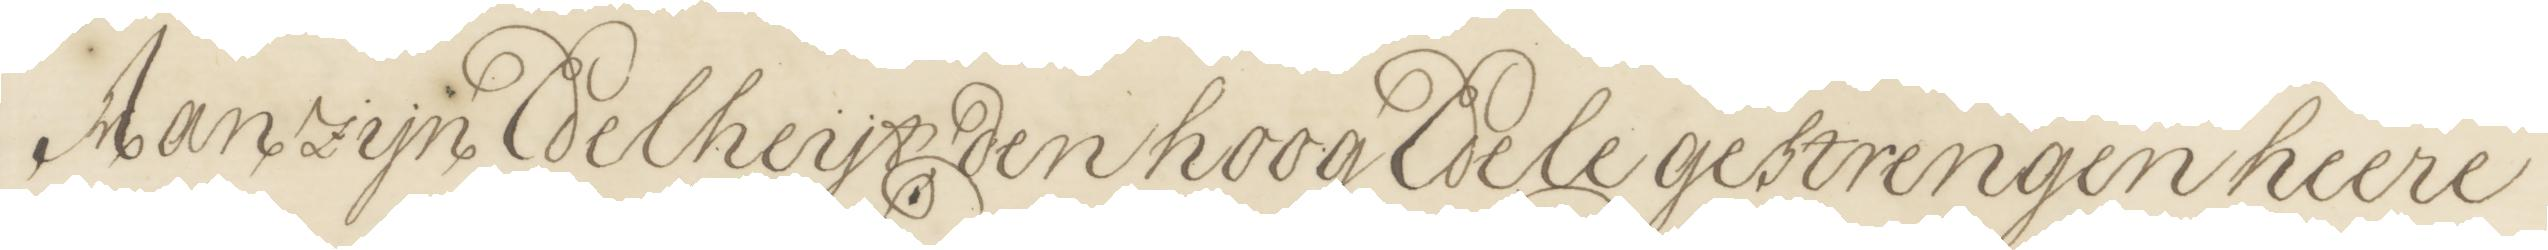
Aan zijn Edelheijt den hoog Edele gestrengen heere
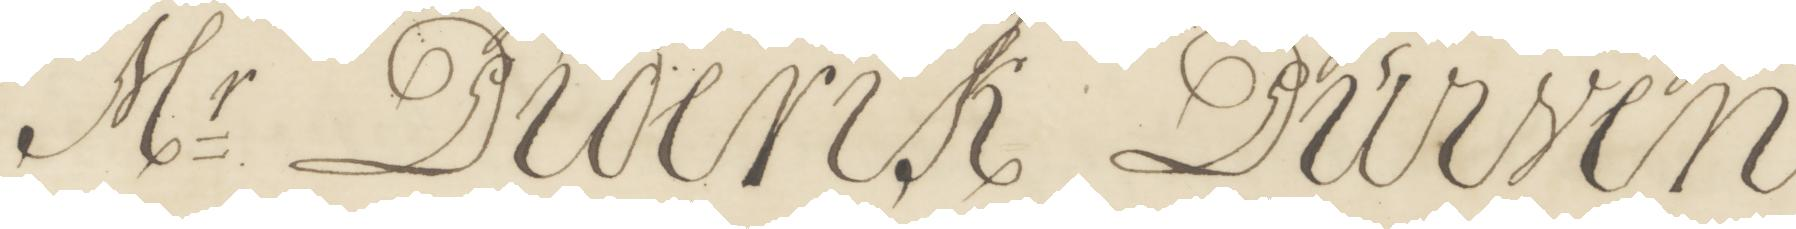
M=r Diderik Durven
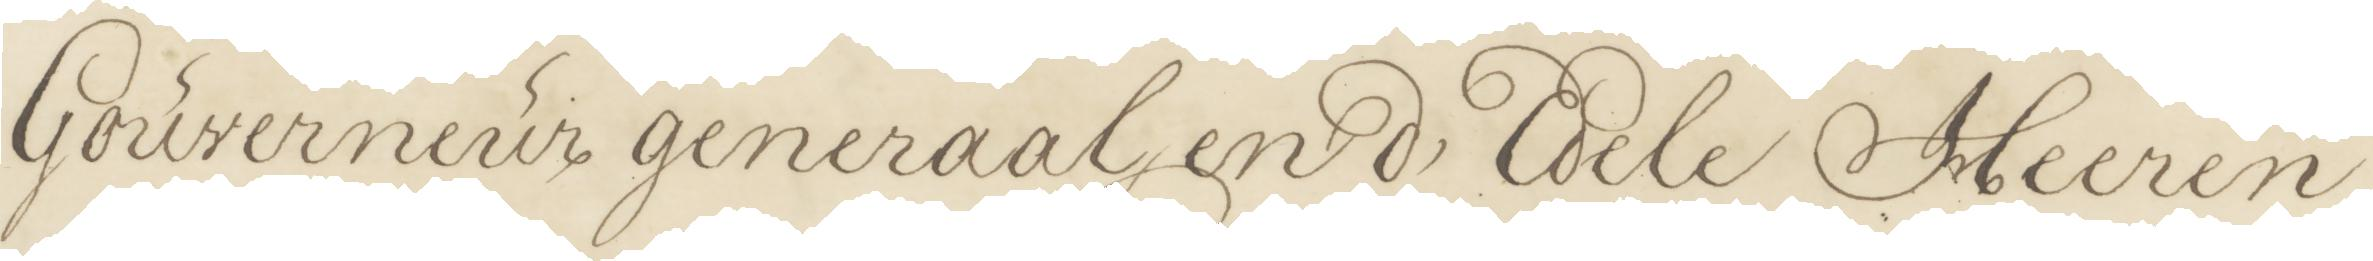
Gouverneur generaal en d’ Edele Heeren
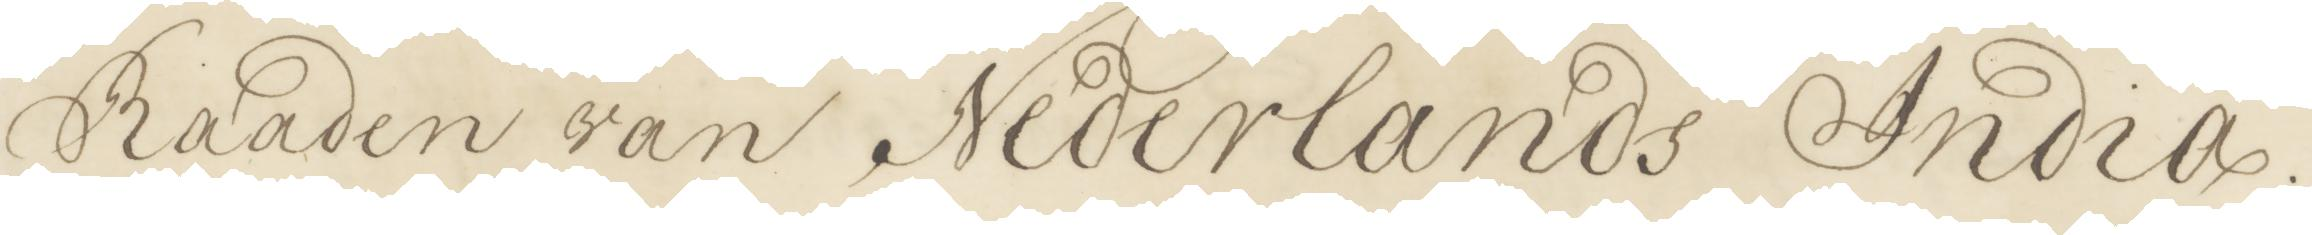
Raaden van Nederlands India
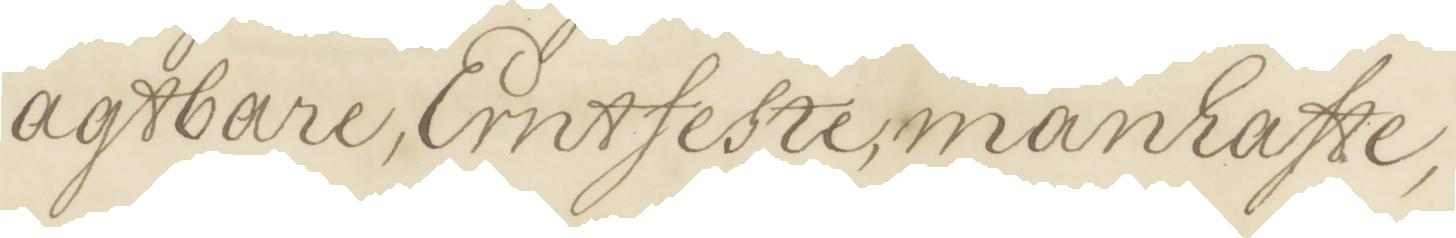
agtbare, Erntfeste, manhafte,
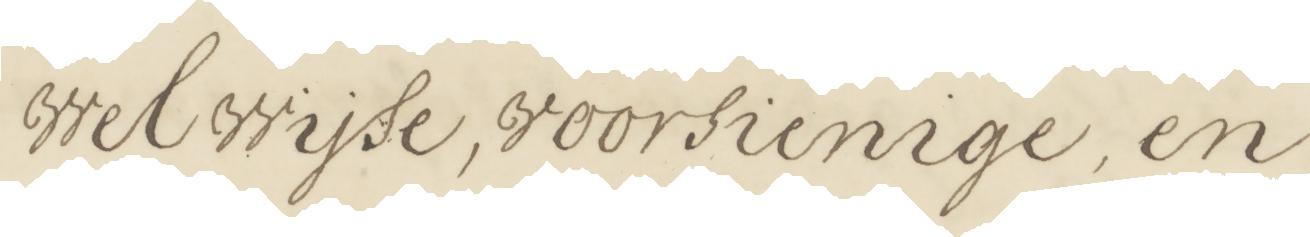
wel wijse, voorsienige, en
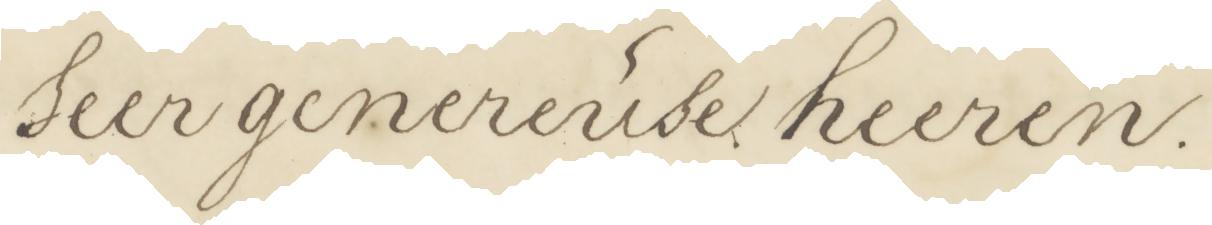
seer genereuse heeren.
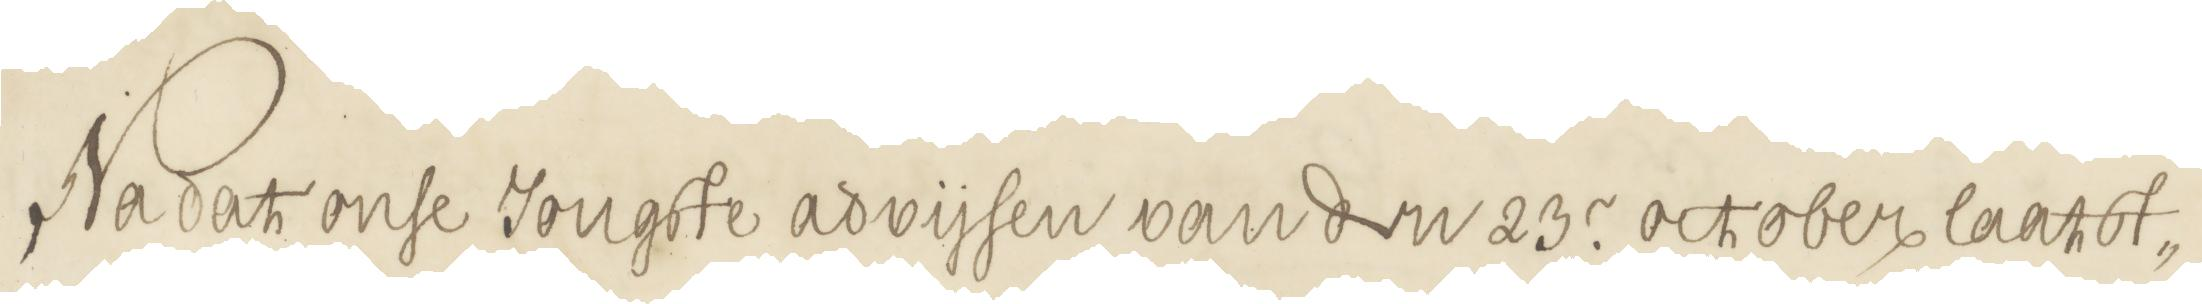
Na dat onse Jongste advijsen van den 23:e october laatst„
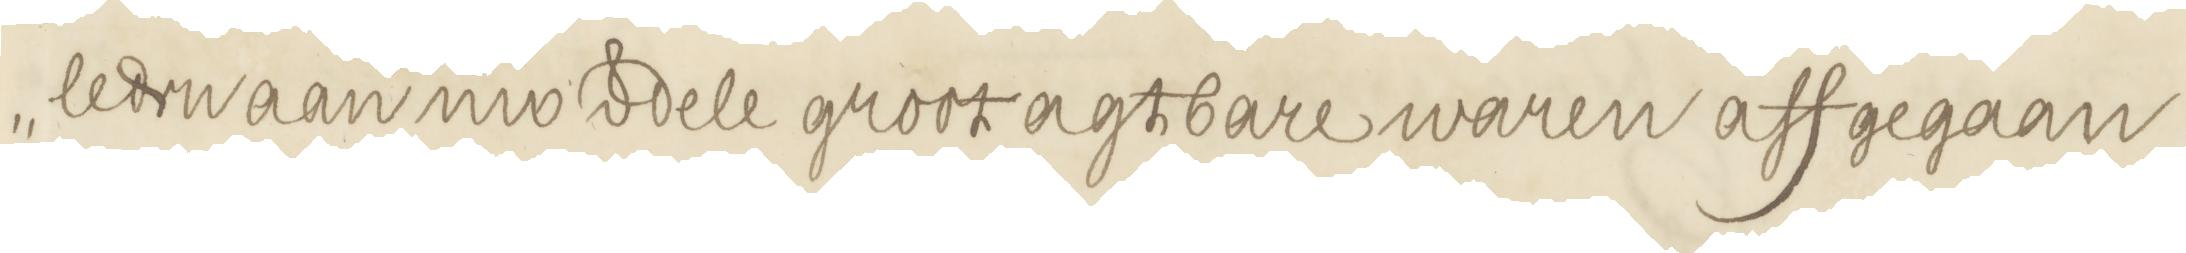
„leden aan uw Edele groot agtbare waren affgegaan
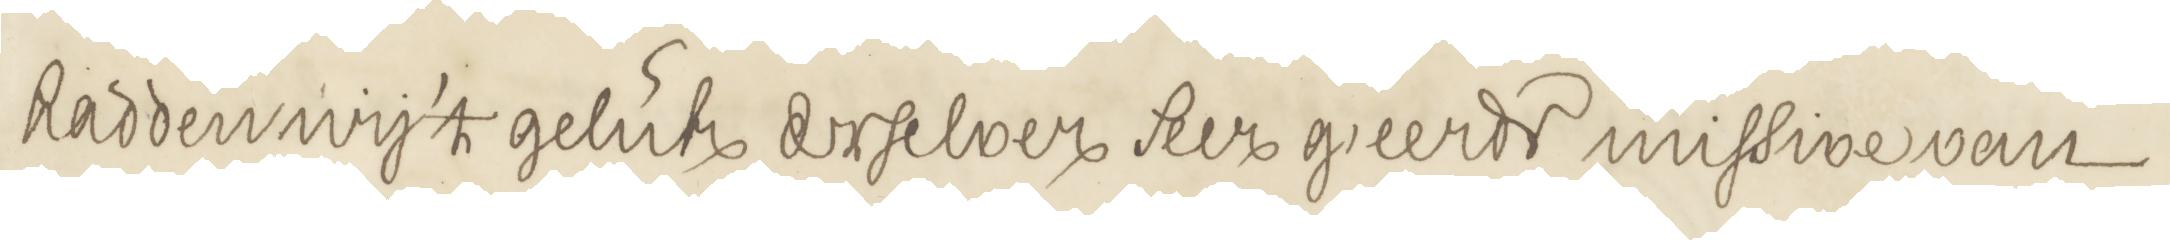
hadden wij ’t geluk derselver seer g'eerde missive van
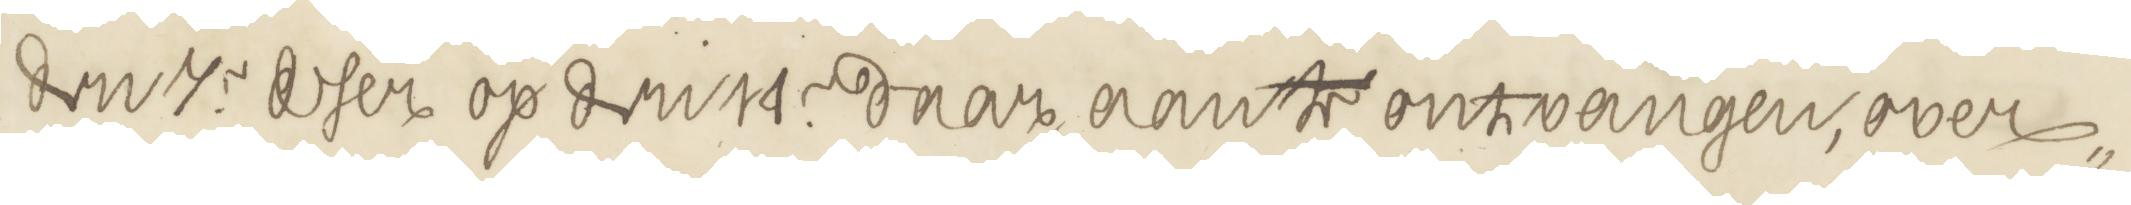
den 7:e deser op den 11:e daar aan te ontvangen, over„
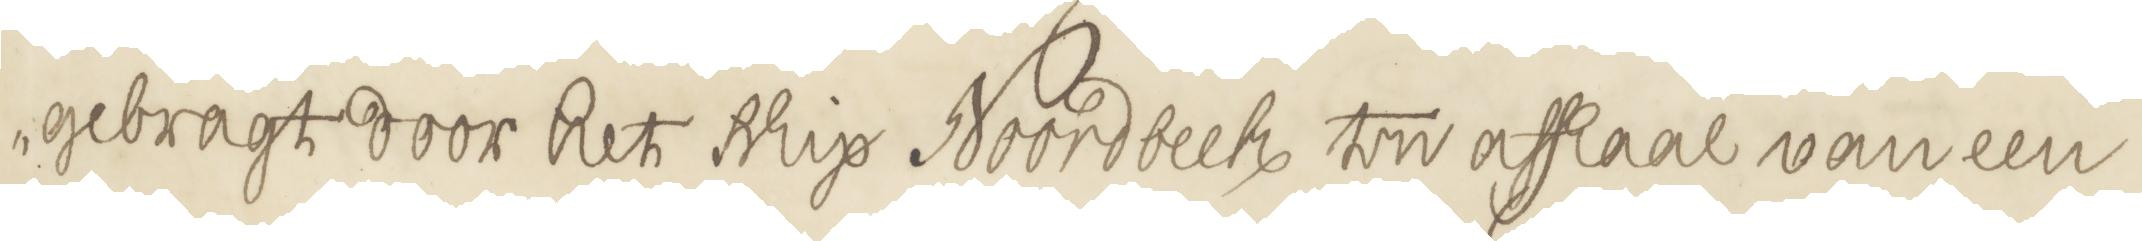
„gebragt door het schip Noordbeek ten afhaal van een
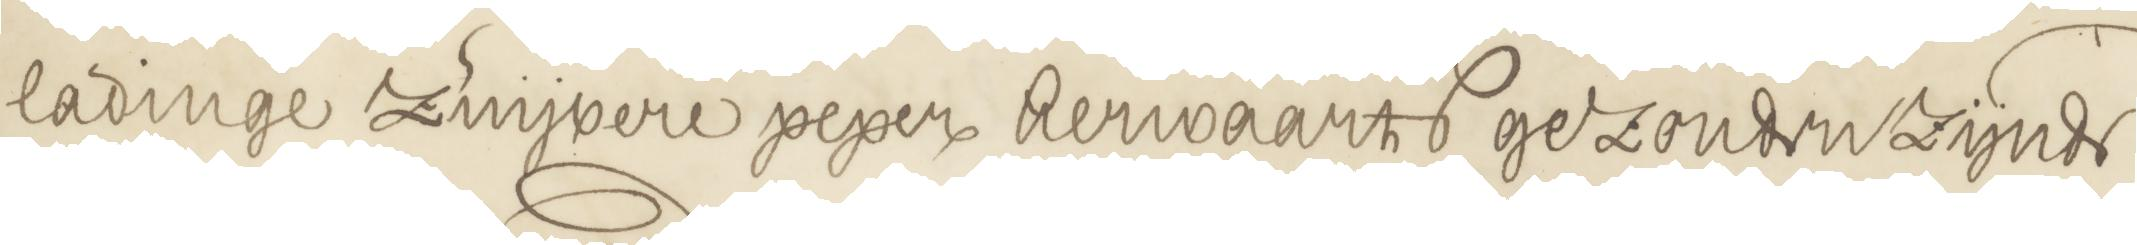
ladinge zuijvere peper herwaarts gezonden zijnde
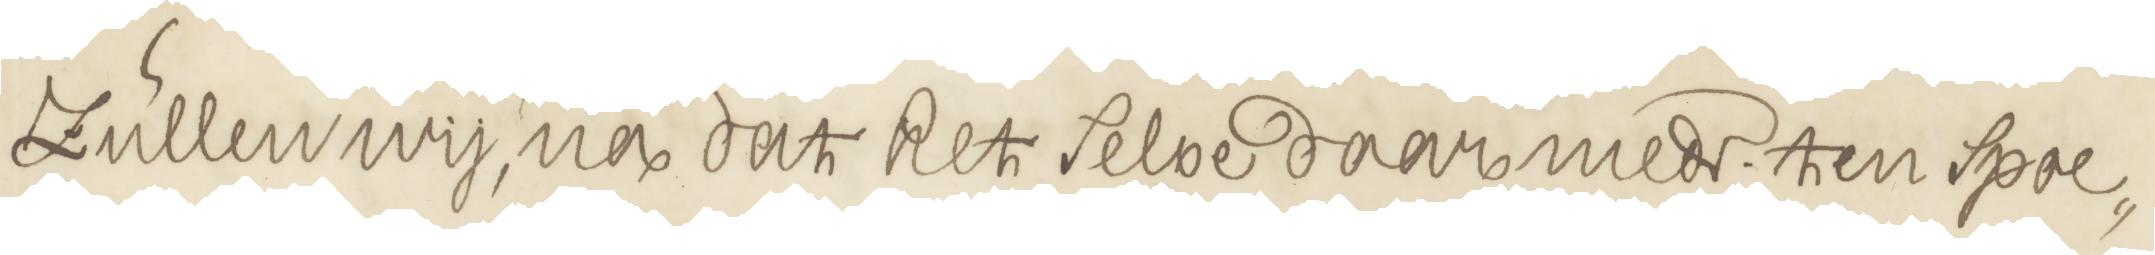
zullen wij, na dat het selve daar mede ten spoe„
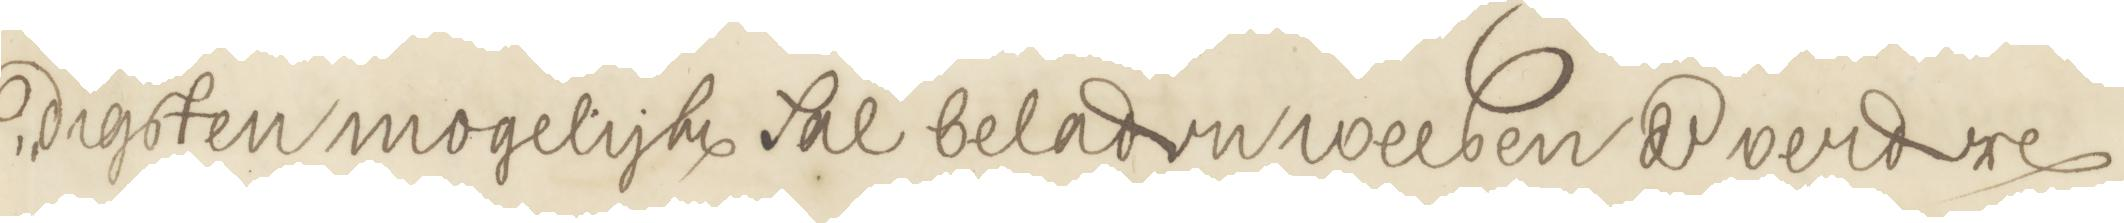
„digsten mogelijk sal beladen weesen de verdere
